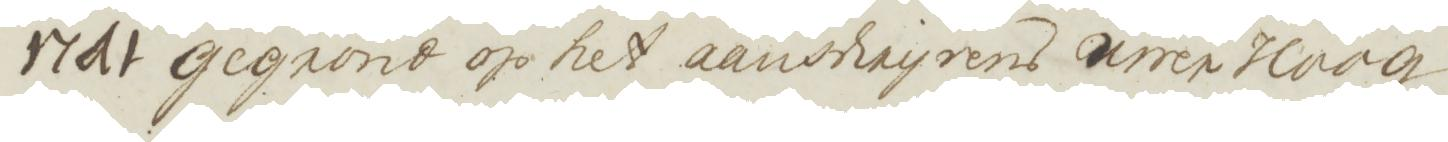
1741 gegrond op het aanschrijvens uwer Hoog
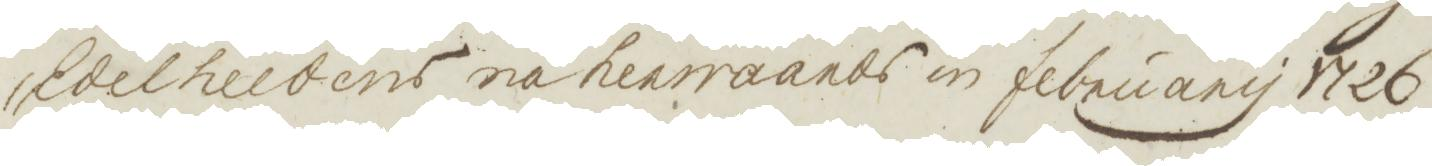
„Edelheedens na herwaards in februarij 1726
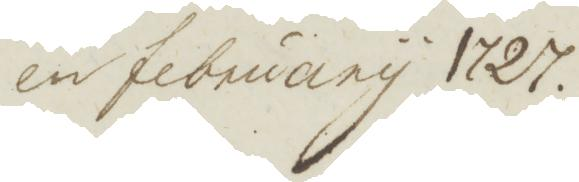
en februarij 1727.
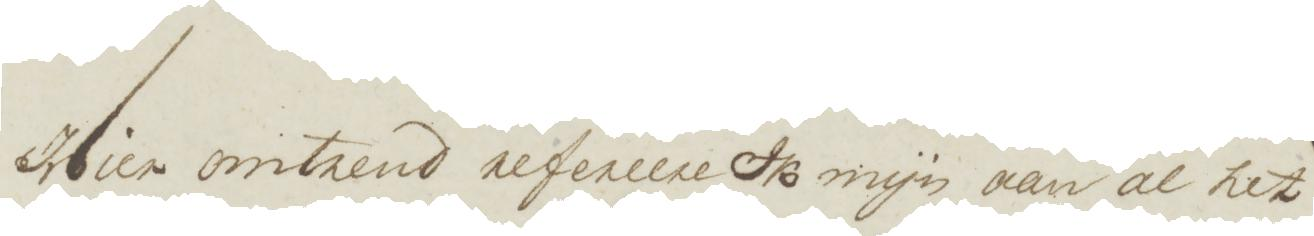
Hier omtrend refereere Ik mijn aan al het
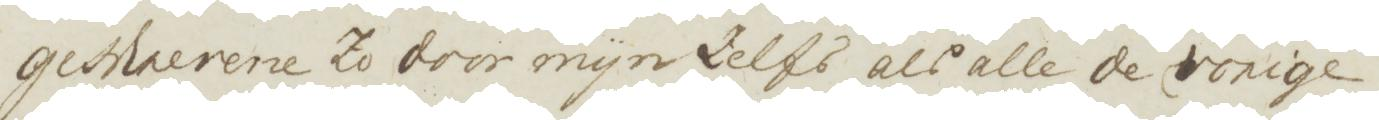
geschrevene zo door mijn zelfs als alle de vorige
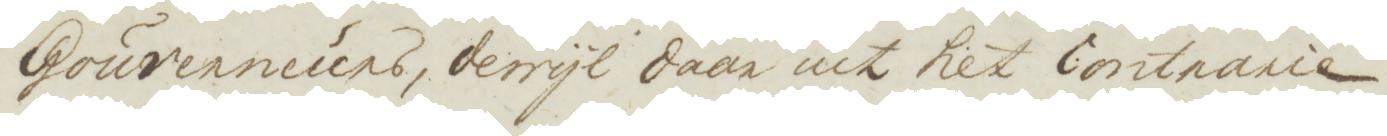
Gouverneurs, dewijl daar uit het contrarie
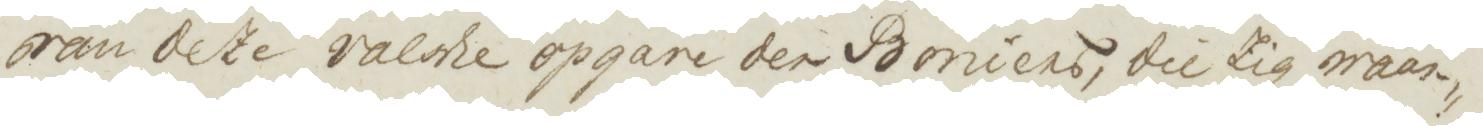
van deze valsche opgave der Boniers, die zig waar„
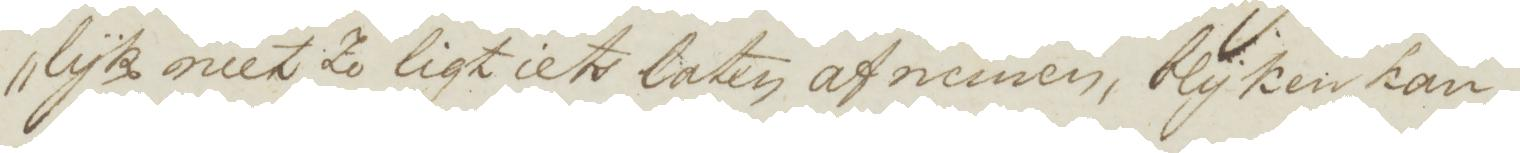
„lijk niet zo ligt iets laten afnemen, blijken kan,
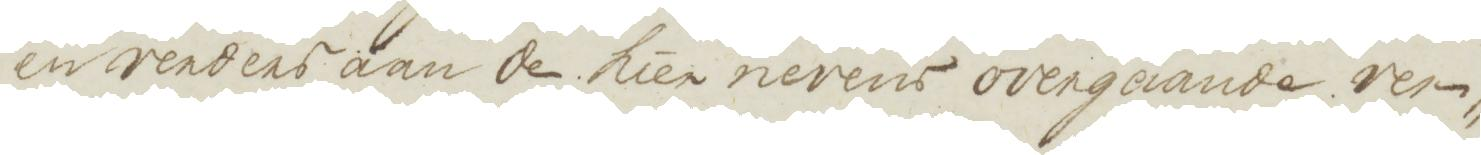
en verders aan de hier nevens overgaande ver
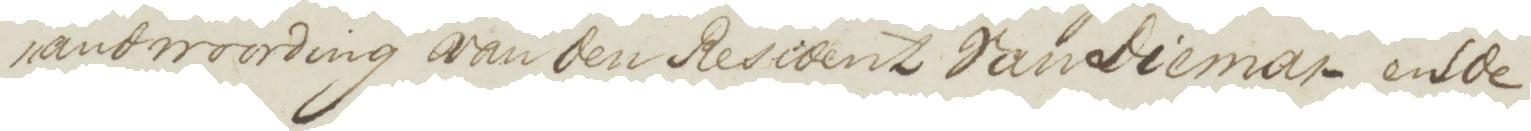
andwoording van den Resident Van Diemar ende
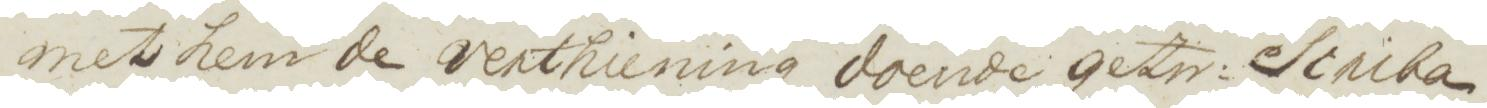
met hem de verthiening doende gezw: Scriba
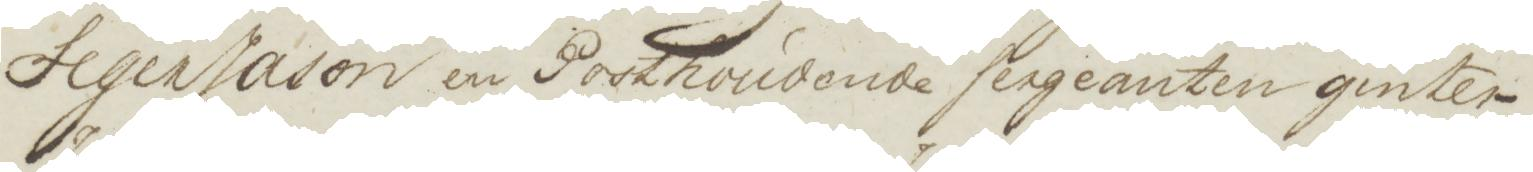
Seger Jason en Posthoudende sergeanten ginter
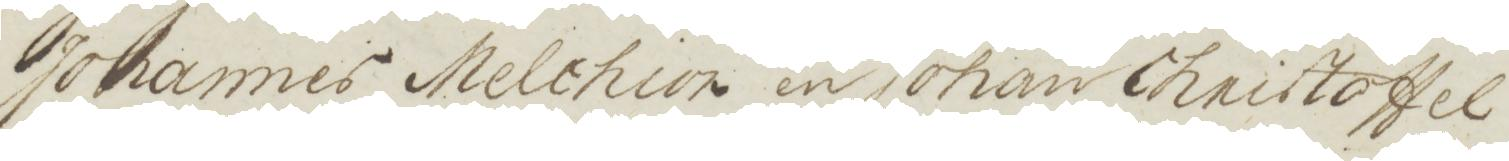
Johannes Melchior en Johan Christoffel
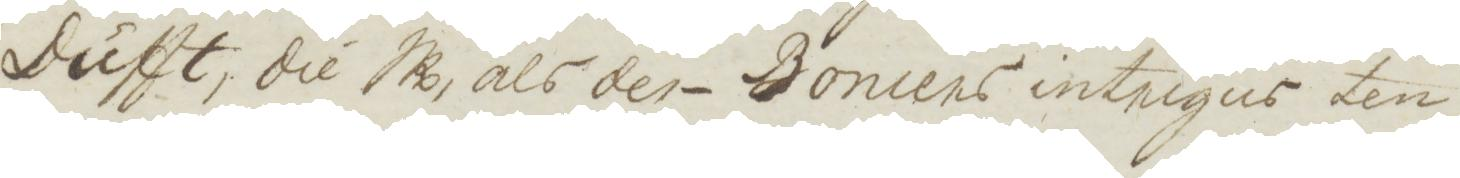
Dufft, die Ik, als der Boniers intrigus ten
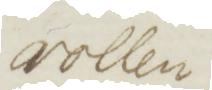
vollen
